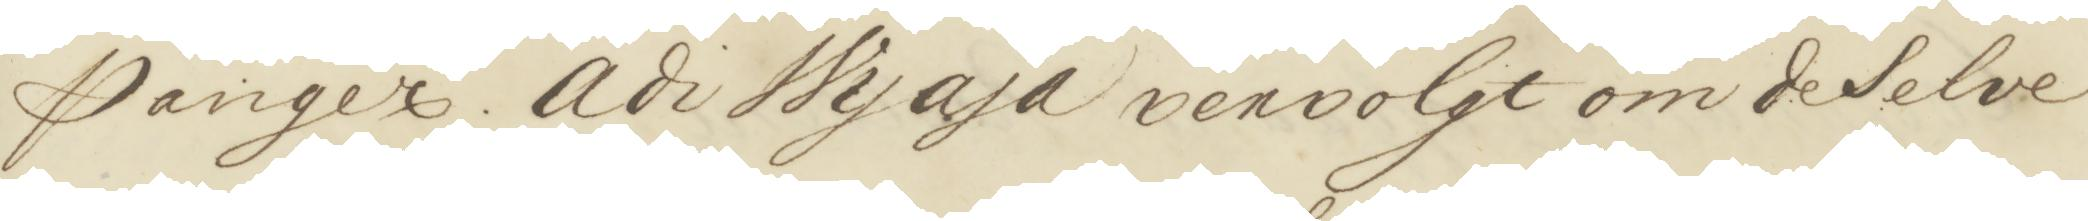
Panger. Adi Wyaja vervolgt om deselve
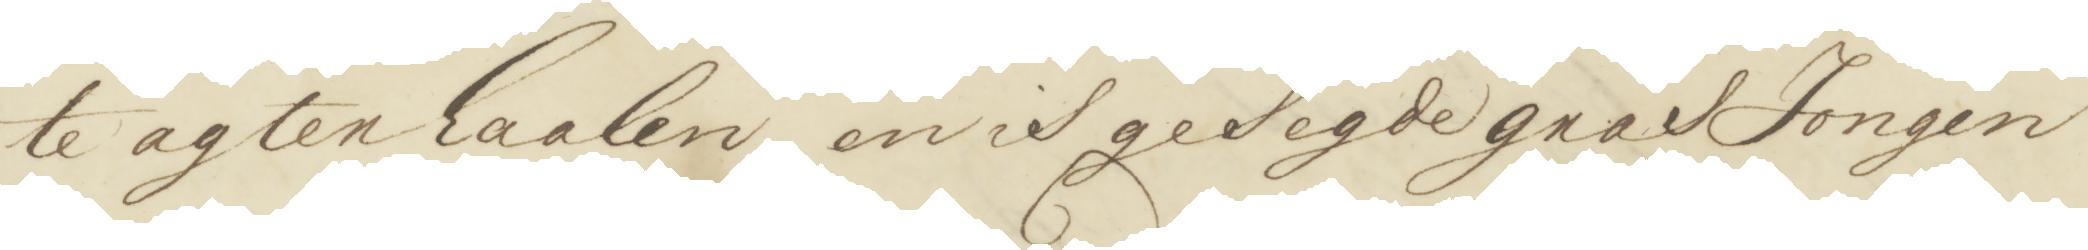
te agterhaalen, en is gesegde gras Iongen
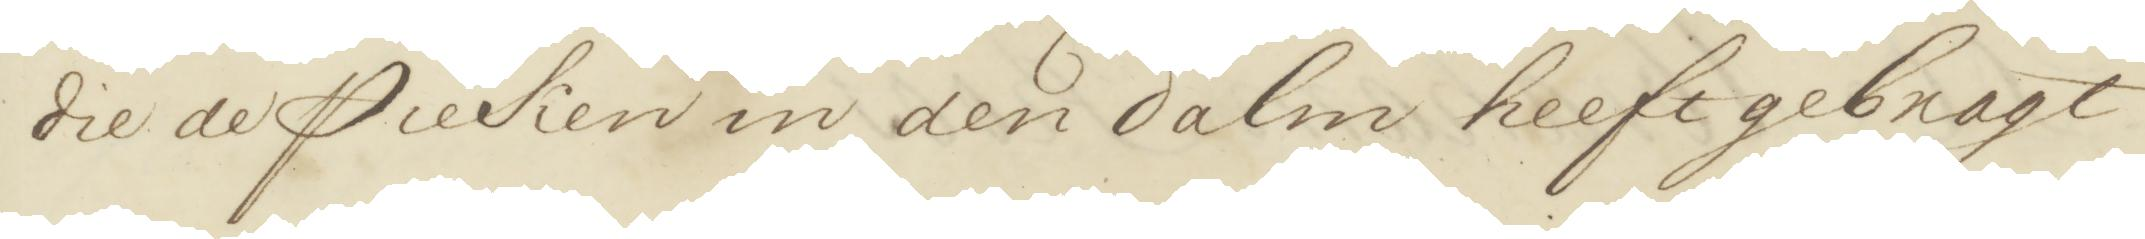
die de Pieken in den dalm heeft gebragt
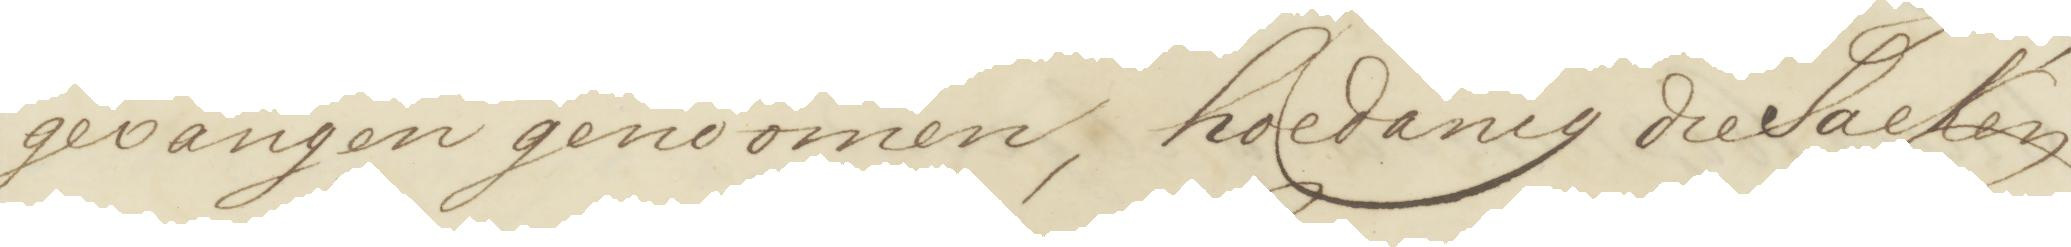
gevangen genoomen, hoedanig die saeken
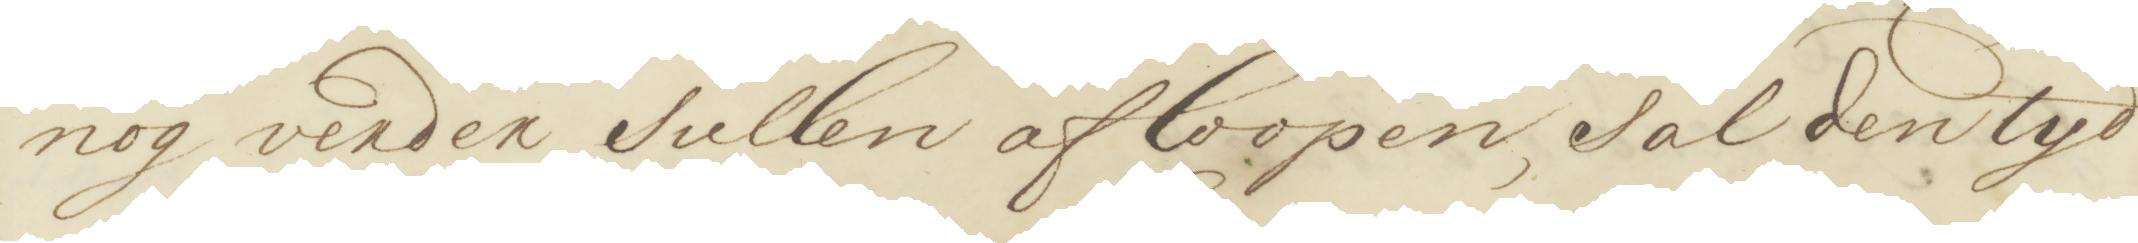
nog verder sullen afloopen, sal den tyd
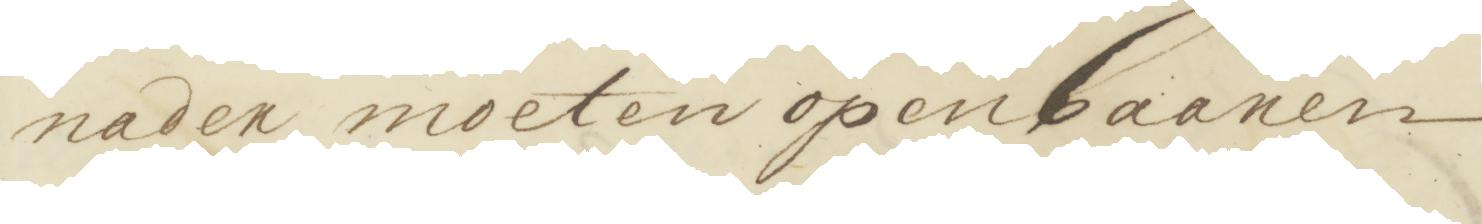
nader moeten openbaaren
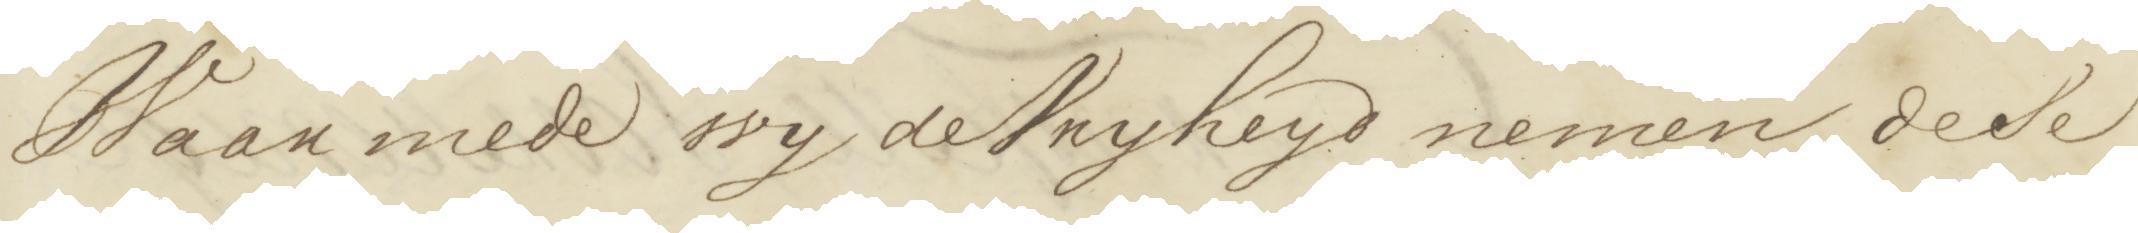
Waar mede wy de Vryheyd nemen, dese
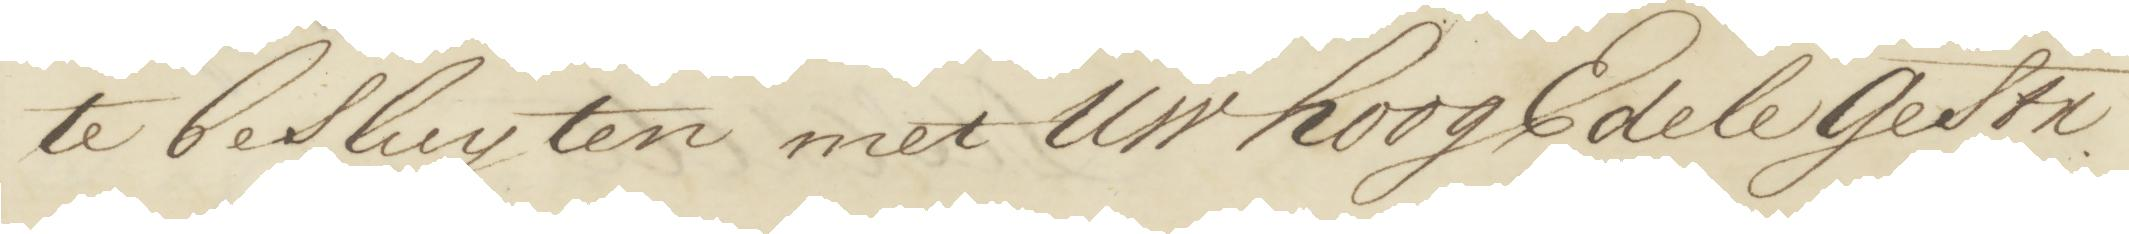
te besluyten met UW hoog Edele Gestr.
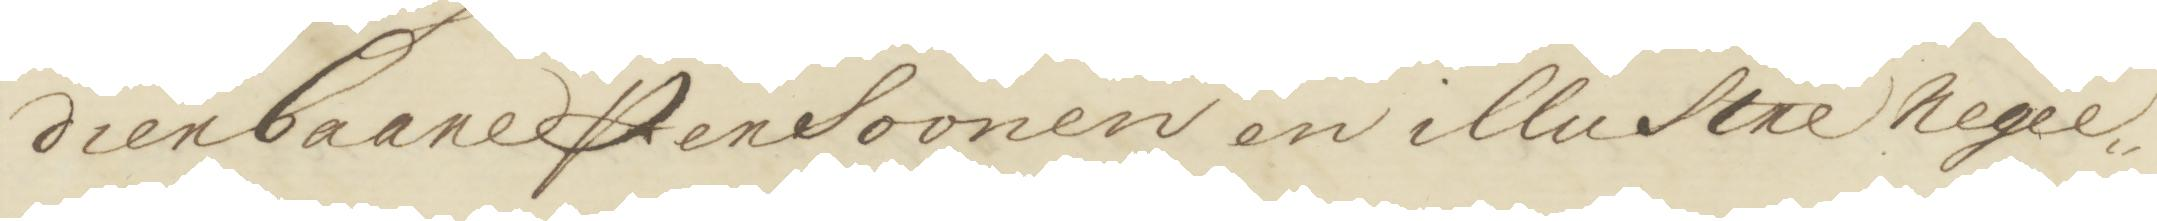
dierbaare Persoonen en illustre Regee„
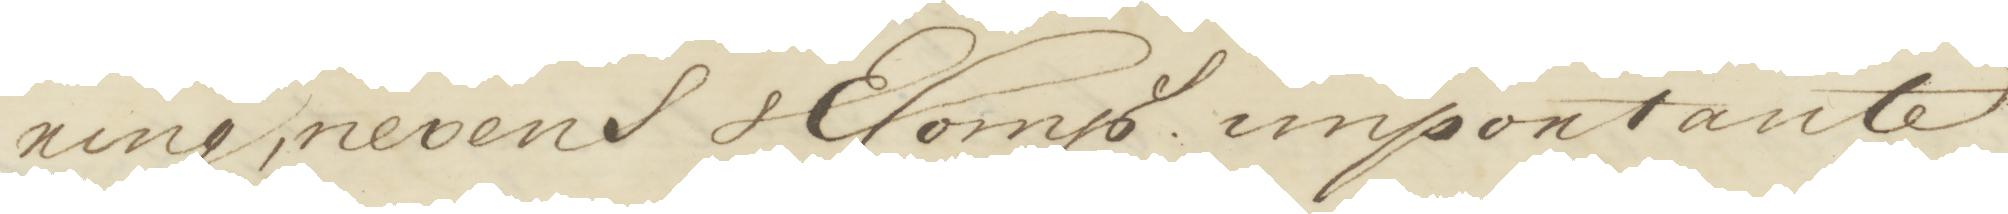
ring, nevens s EComp.s importante
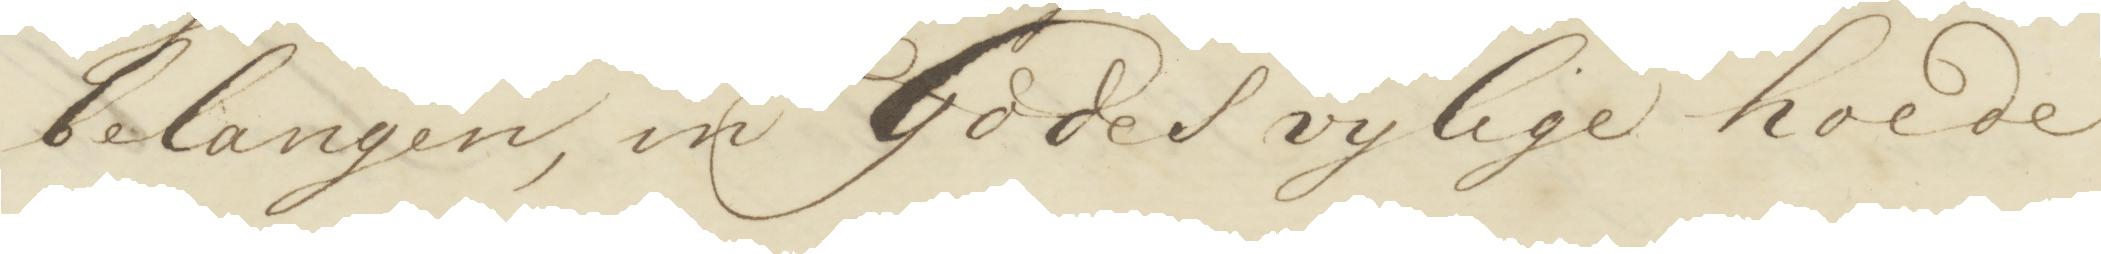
belangen, in Godes vylige hoede
